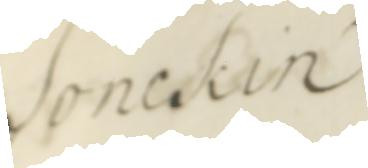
Tonckin
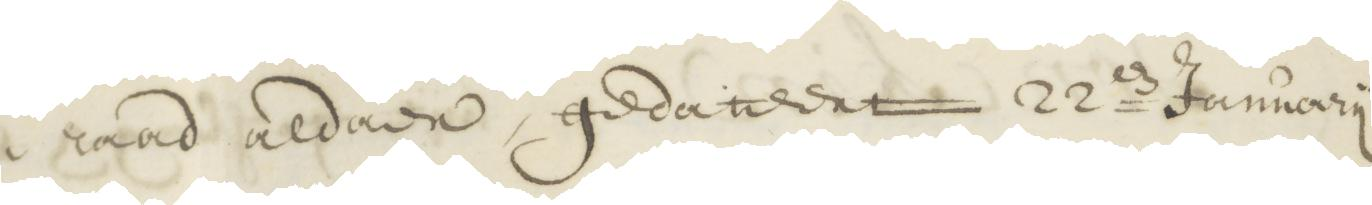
En raad aldaer, gedateert 22=en Januarij
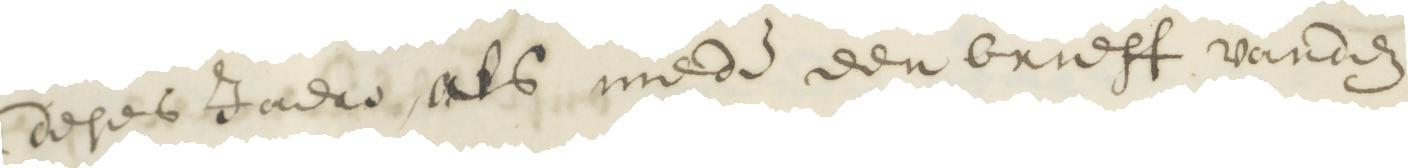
deses Jaere als mede een brieff vanden
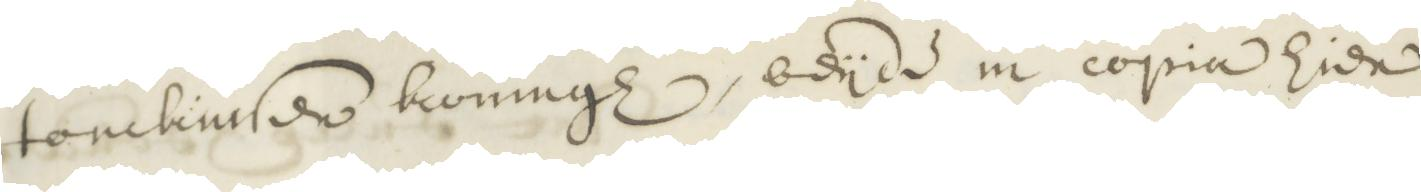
tonckinsser koningh, beijde in copia hier
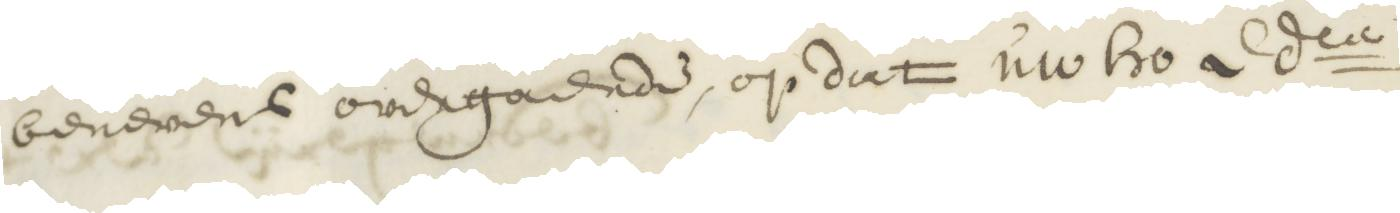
benevens overgaende, op dat uw ho Ed=en
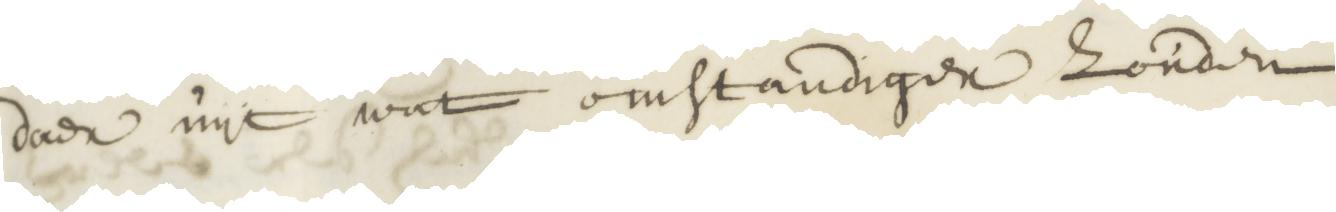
daer uijt wat omstandiger zouden
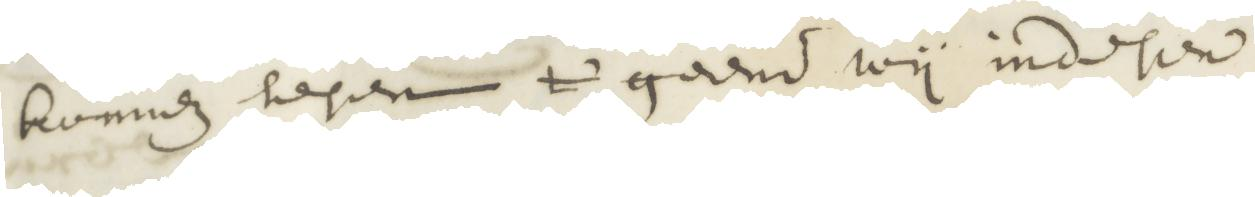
konnen lesen t' geene wij indesen
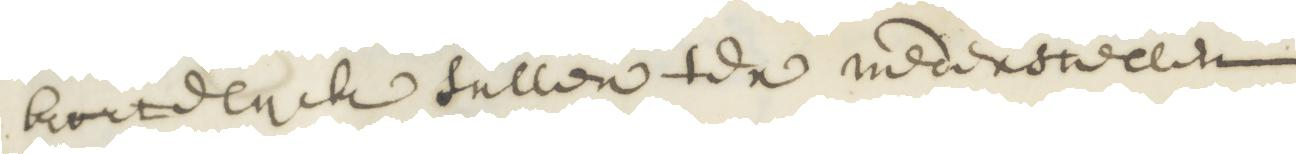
kortelyck sullen ter nederstellen
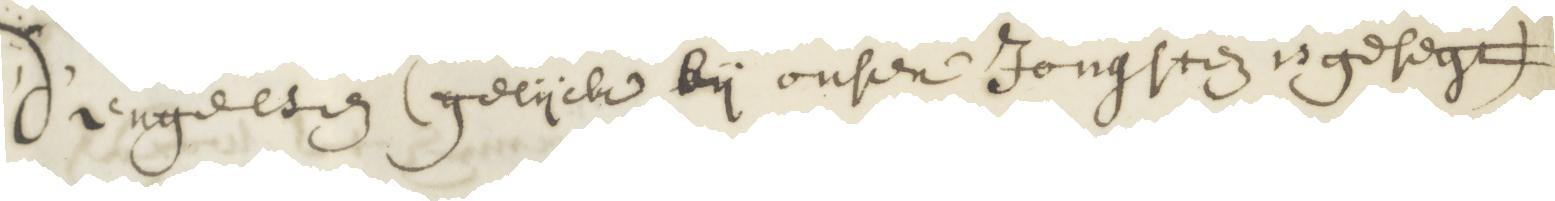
d'engelsen (gelijck bij onser Jongsten is gesegt)
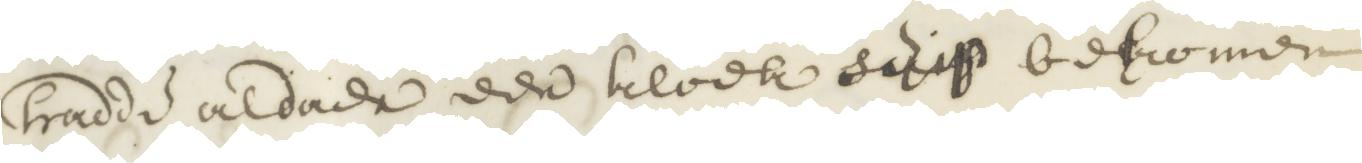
hadde aldaer een kloek schip bekomen
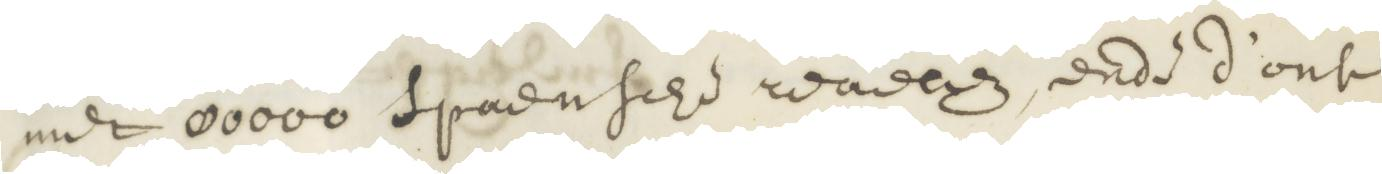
met 80000 spaensche reaelen, ende d’ onse
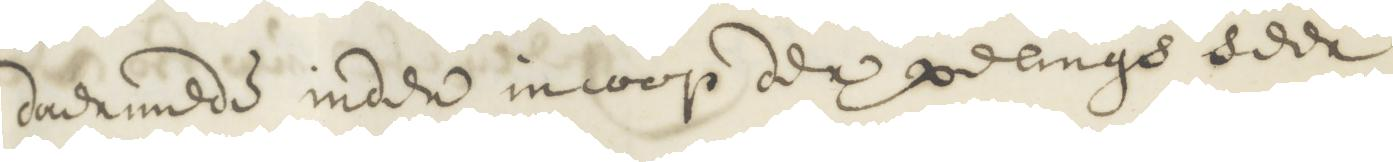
daermede inder incoop der pelings seer
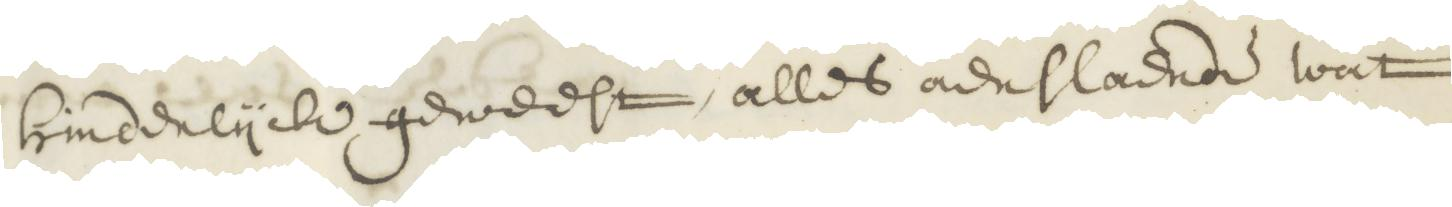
hinderlijck geweest, alles aenslaende wat
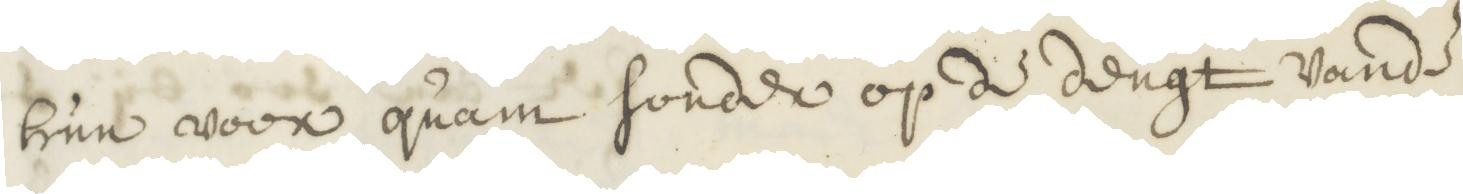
hun voor quam sonder op de deugt vande
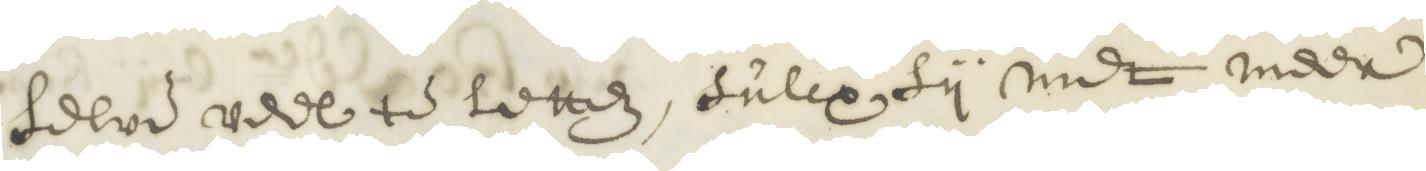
selve veel te letten, sulcx sij niet meer
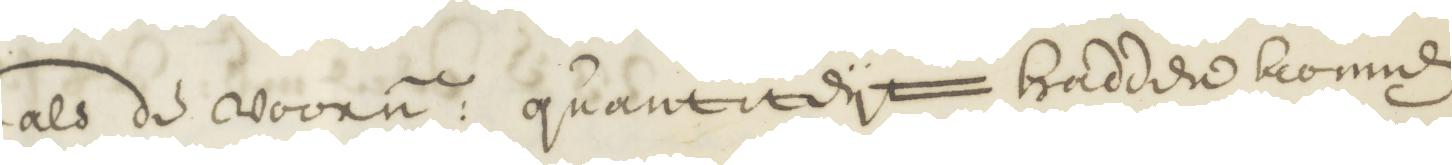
als de voorn: quantiteijt hadden konnen
